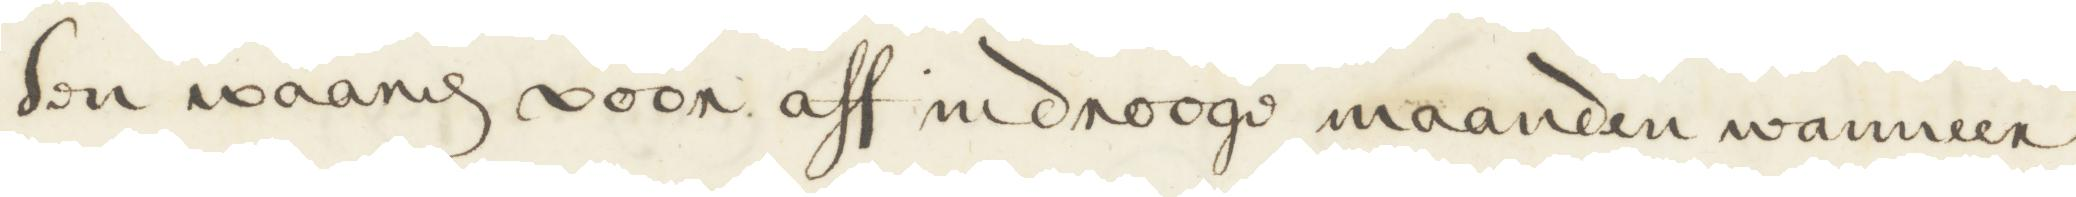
ten waaren voor aff in drooge maanden wanneer
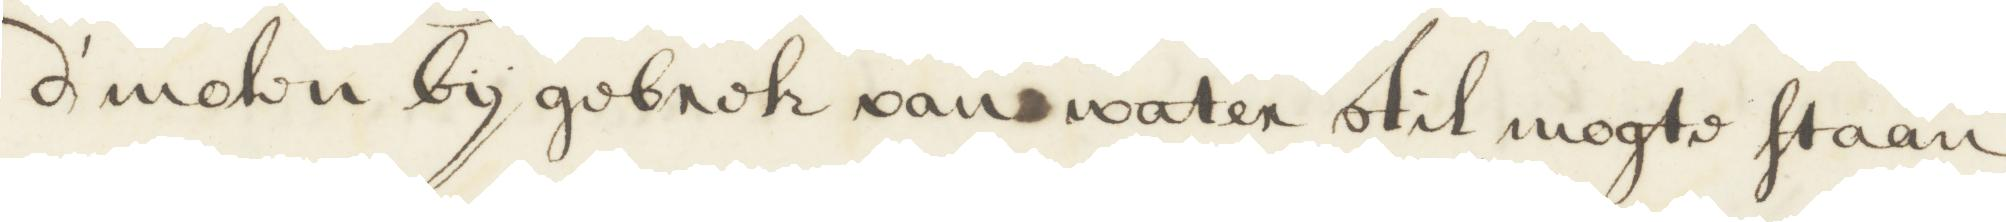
d’ molen bij gebrek van water stil mogte staan
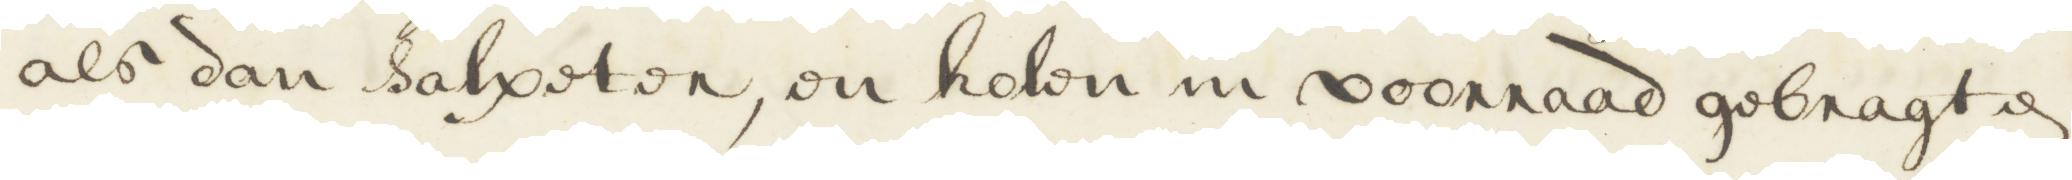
als dan salpeter, en kolen in voorraad gebragt en
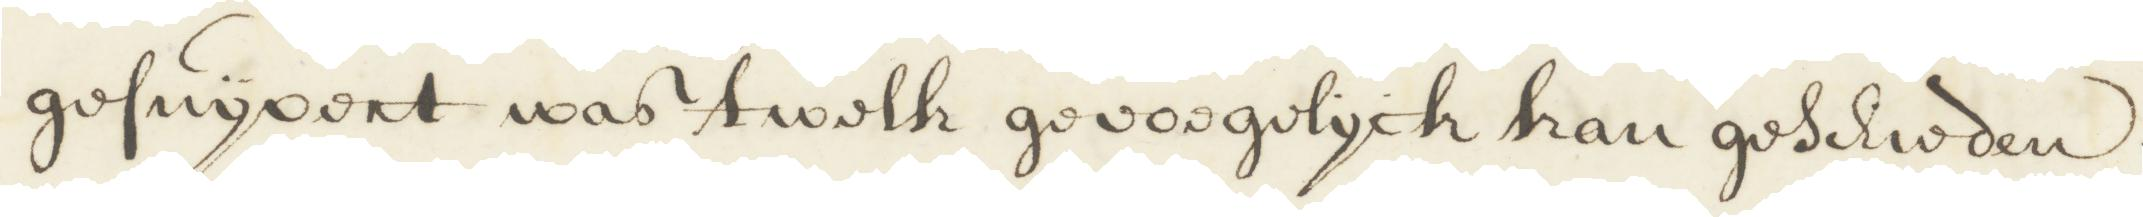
gesuijvert was 't welk gevoegelijck kan geschieden
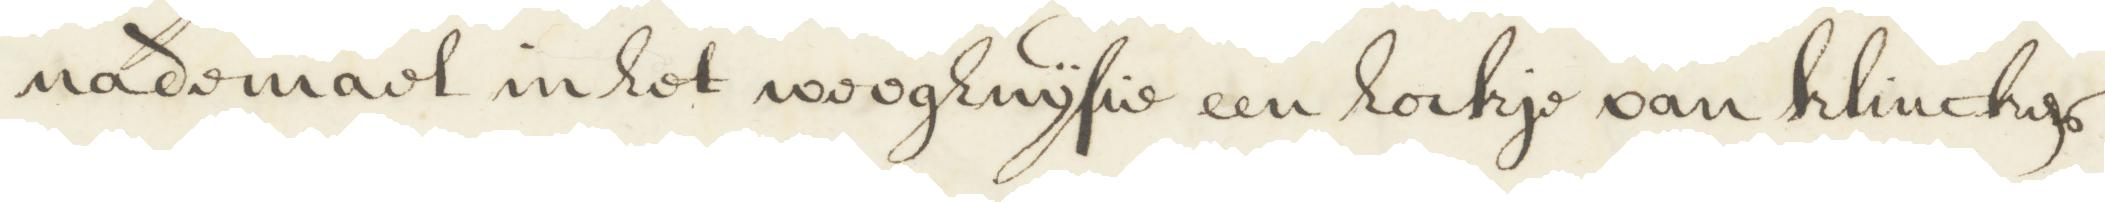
nademael in het weeghuijsie een hockje van klincker
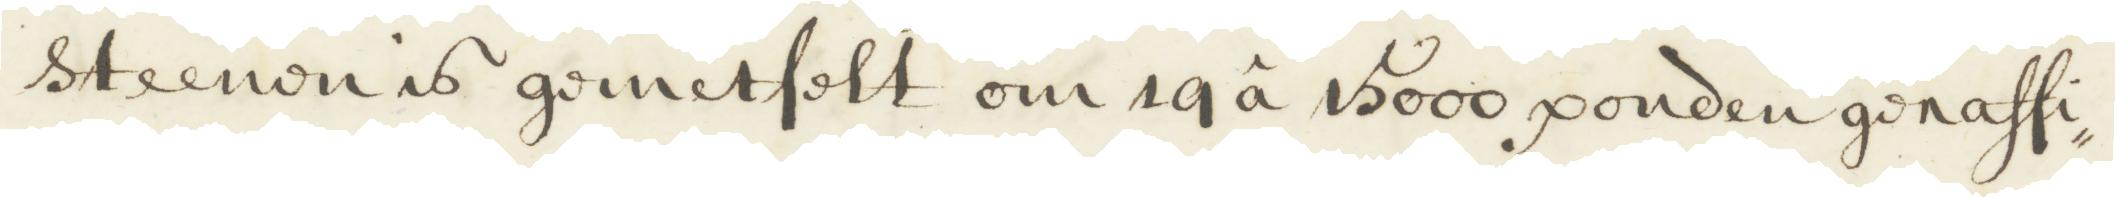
steenen is gemetselt om 14 â 15000 ponden geraffi„
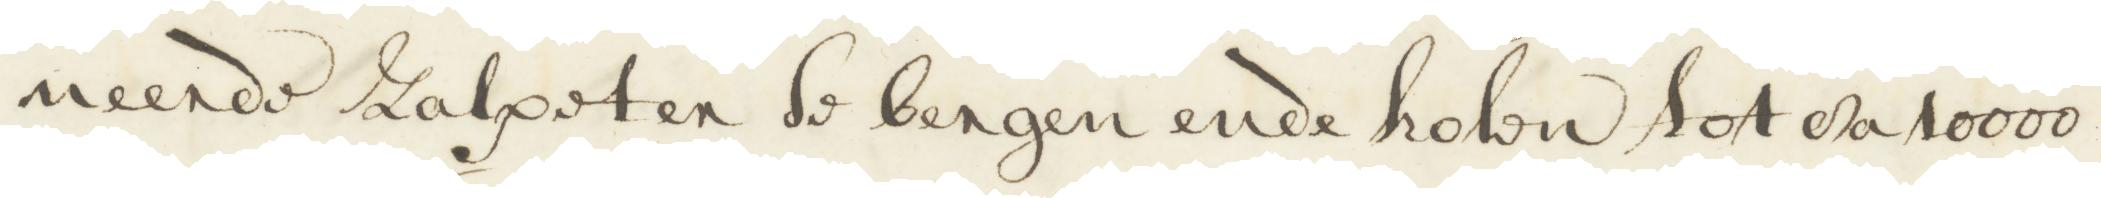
neerde zalpeter te bergen ende kolen tot 8 a 10000
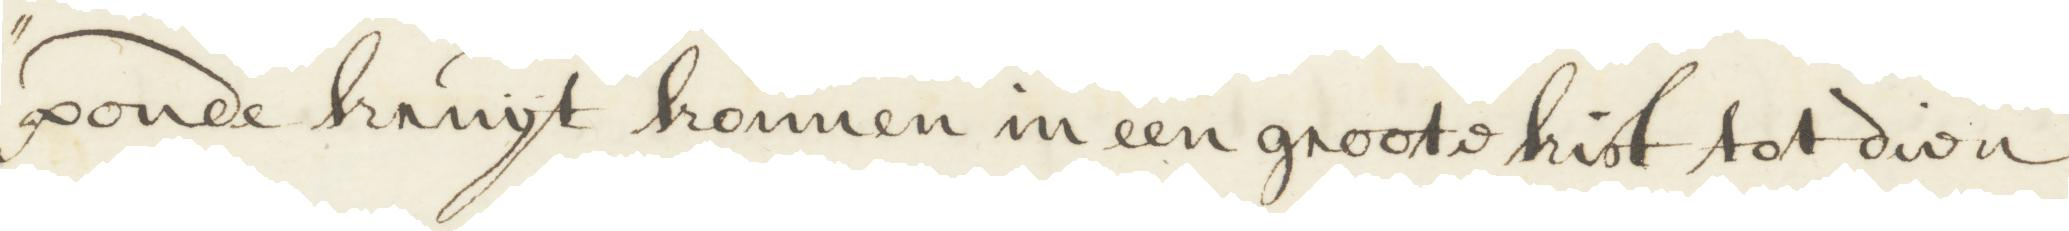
ponde kruijt konnen in een groote kist tot dien
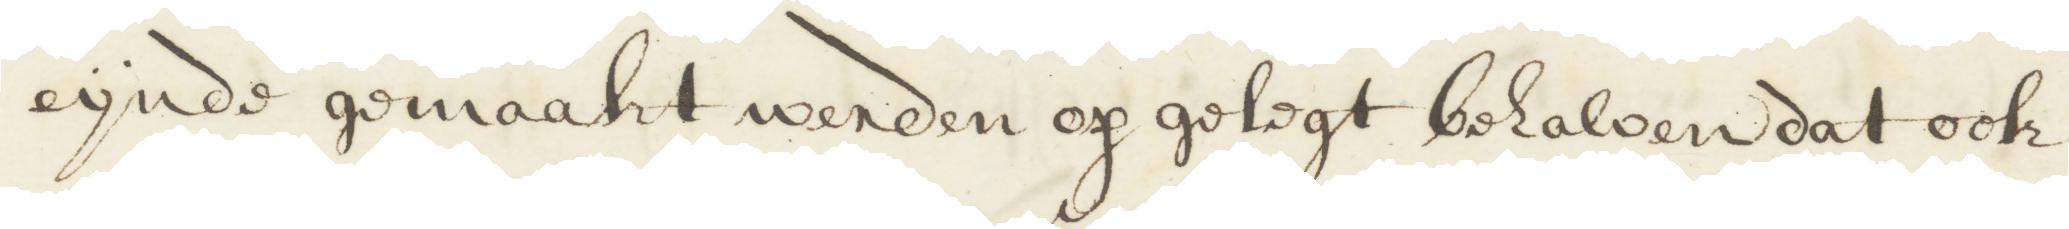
eijnde gemaakt werden op gelegt behalven dat ook
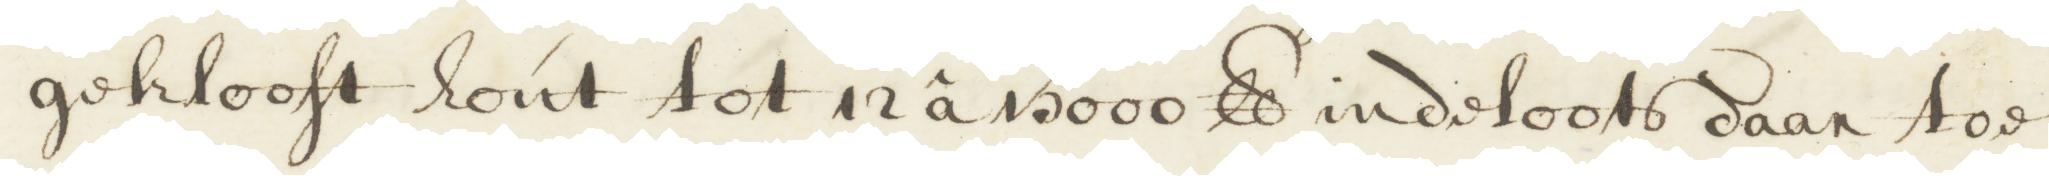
geklooft hout tot 12 â 15000 lb in de loots daar toe
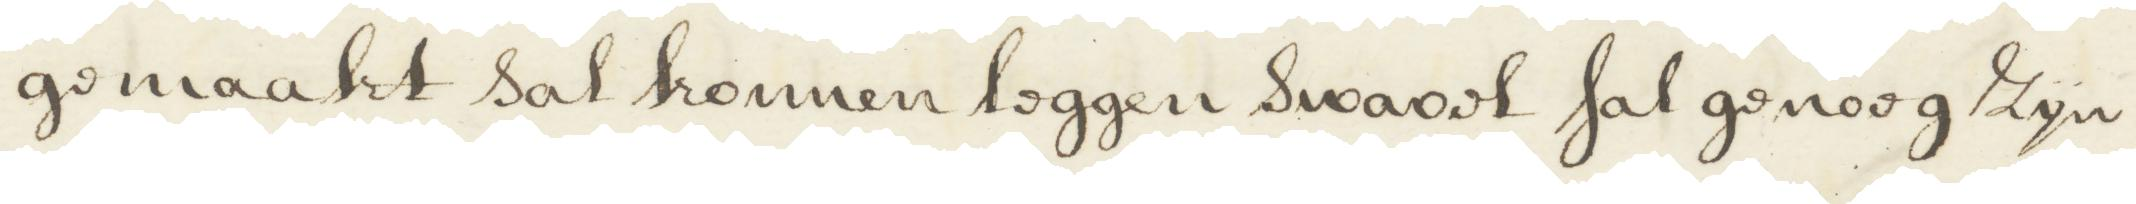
gemaakt sal konnen leggen swavel sal genoeg zijn
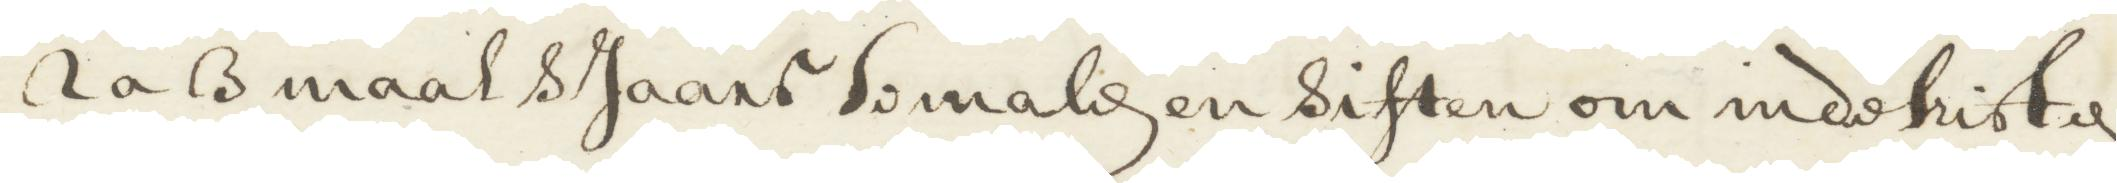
2 a 3 maal sJaars te malen en siften om in de kisten
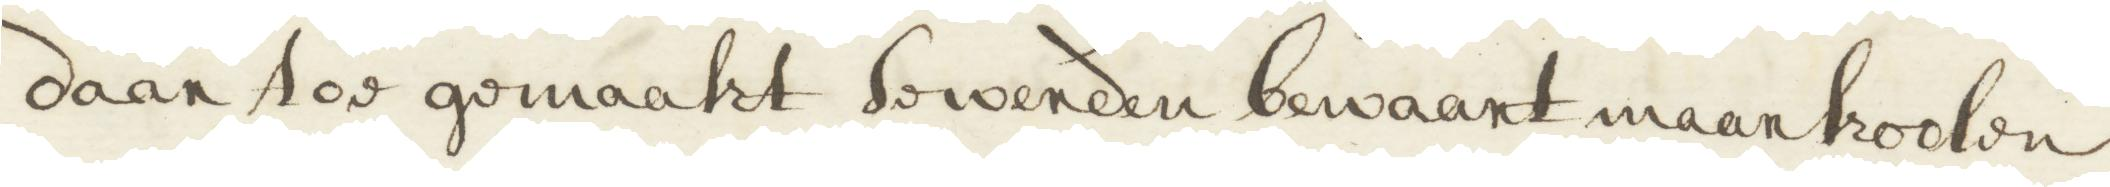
daar toe gemaakt te werden bewaart maar koolen
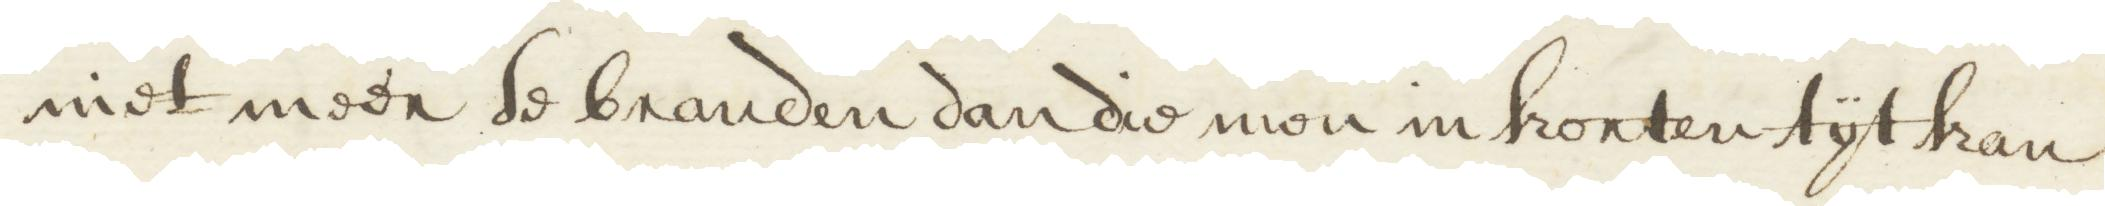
niet meer te branden dan die men in korten tijt kan
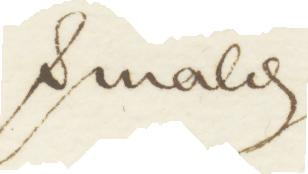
vermalen
